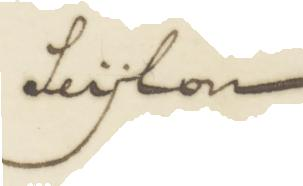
seijlon
